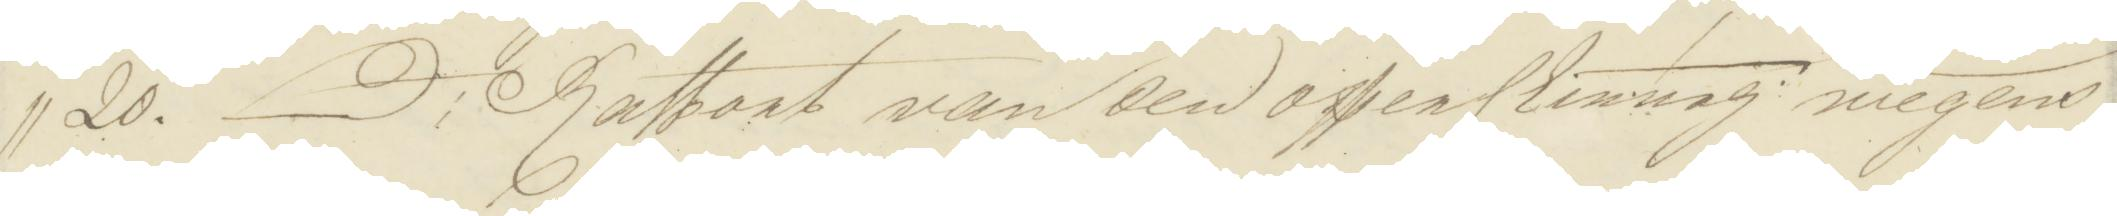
„ 20. — D: Rapport van den opper Chirurg: wegens
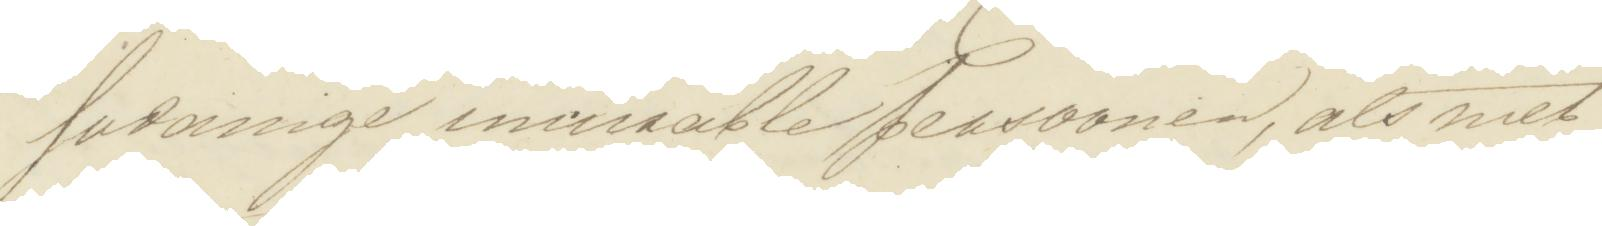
sodanige incurable persoonen, als met
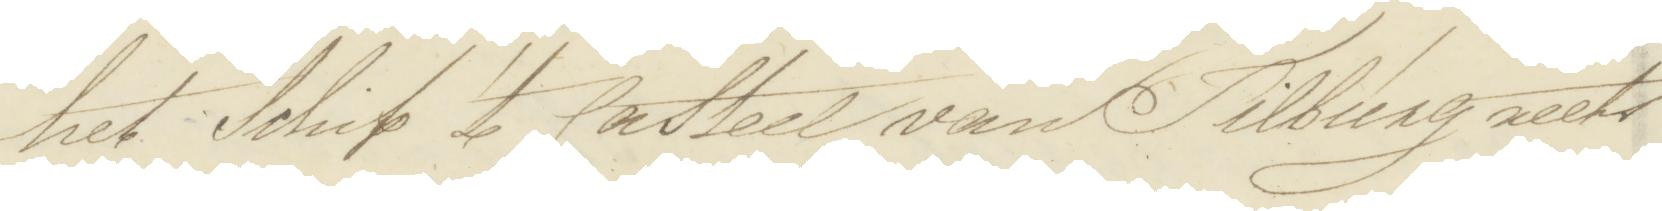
het schip ’t Casteel van Tilburg reets
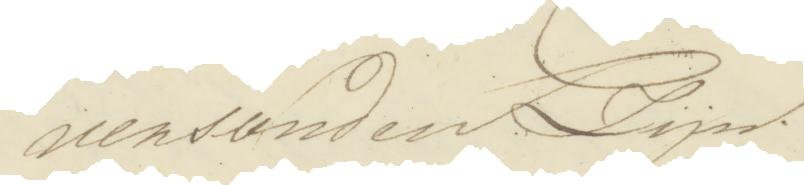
versonden zijn.
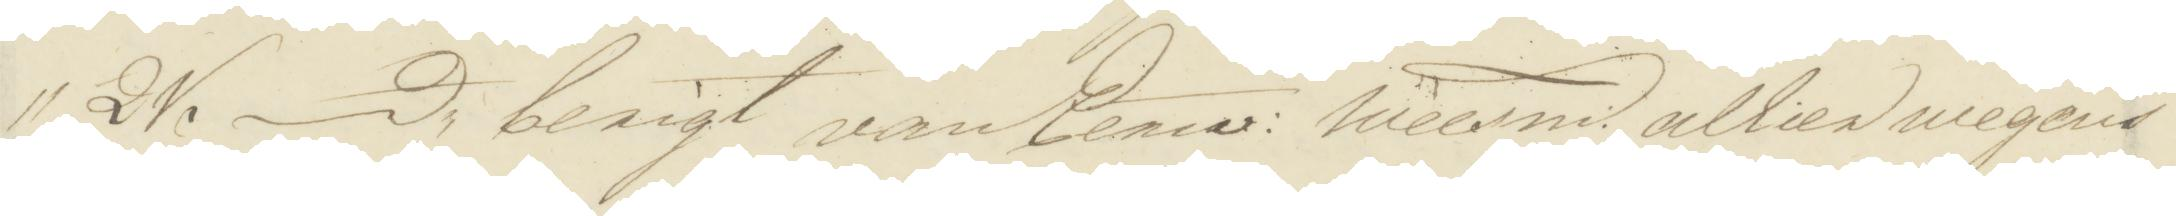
„ 21. —D„ berigt van Eerw: weesm: alhier wegens
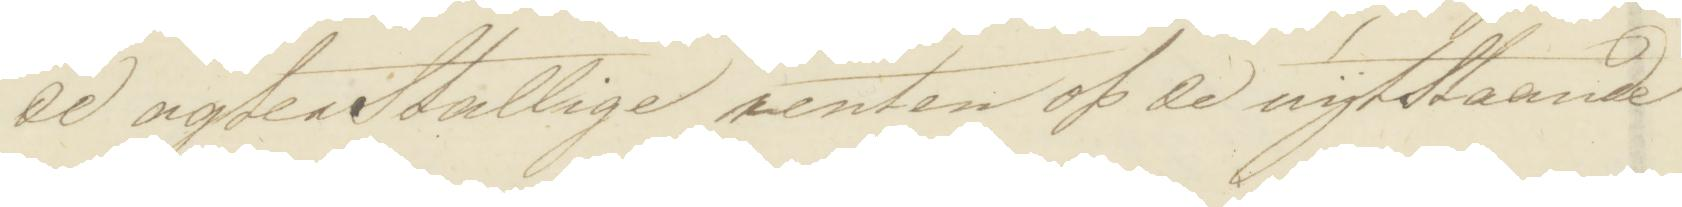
de agterstallige renten op de uijtstaande
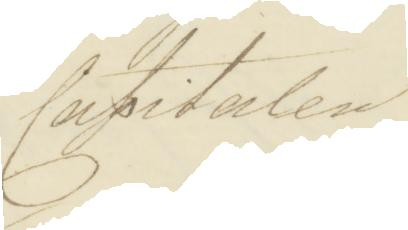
Capitalen
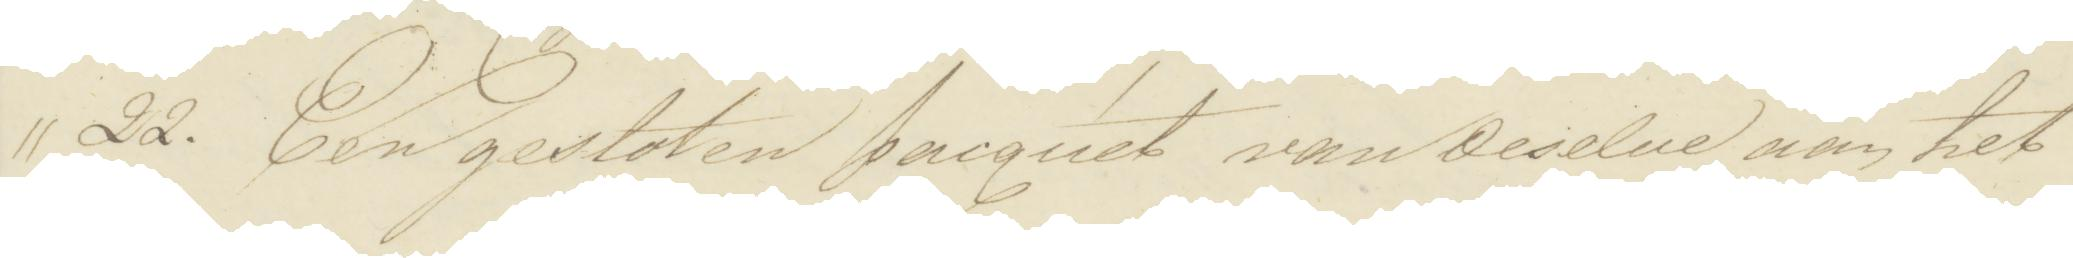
„ 22. Een gesloten pacquet van deselve aan het
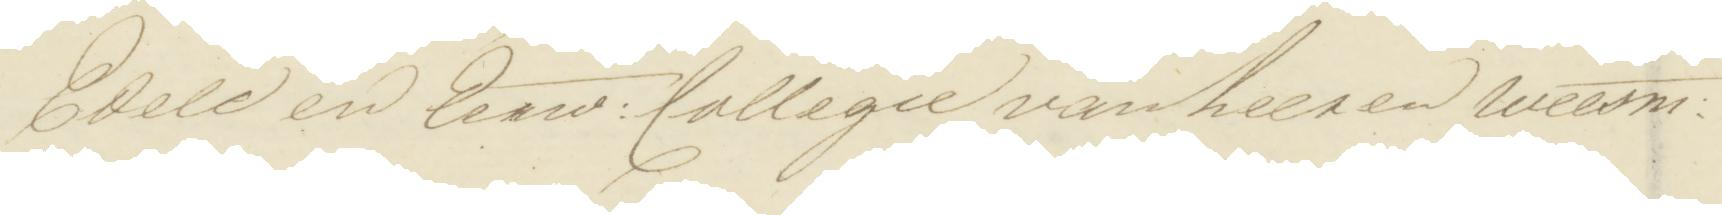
Edele en Eerw: Collegie van heeren weesm:
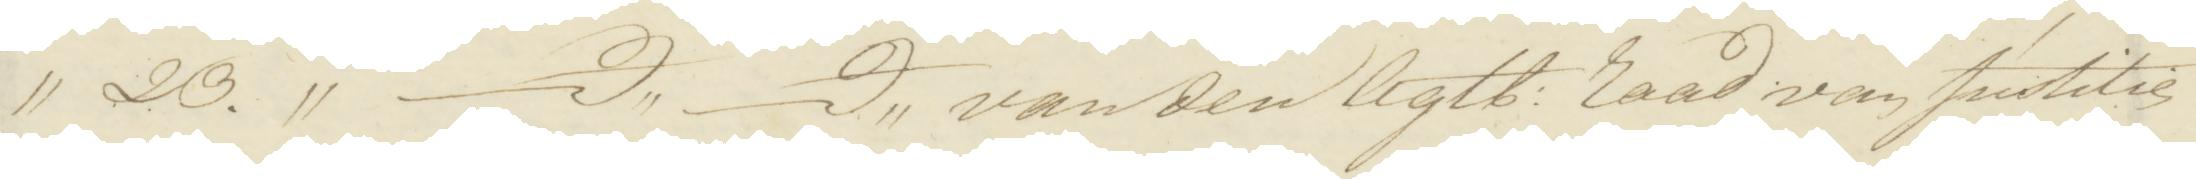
„ 23. „ —D„ D„ van den Agtb: Raad van Justitie
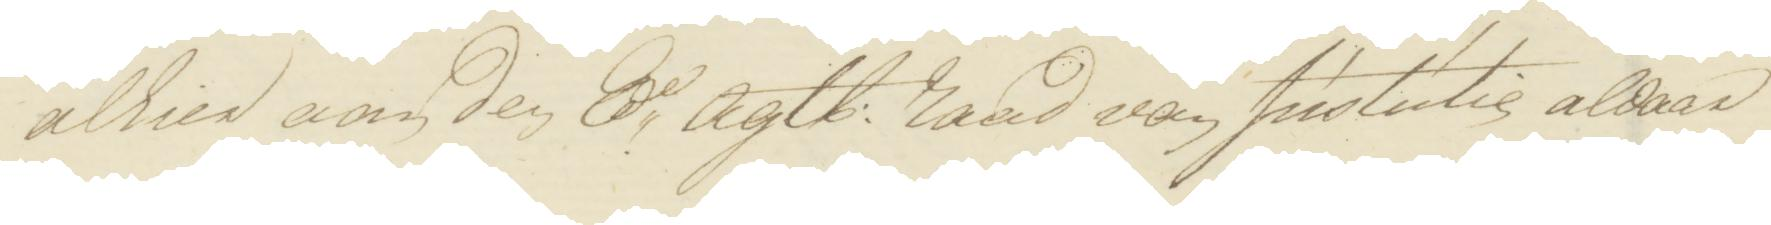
alhier aan den Ed„e agtb: Raad van Justutie aldaar
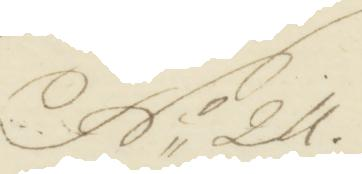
N„o 24.
